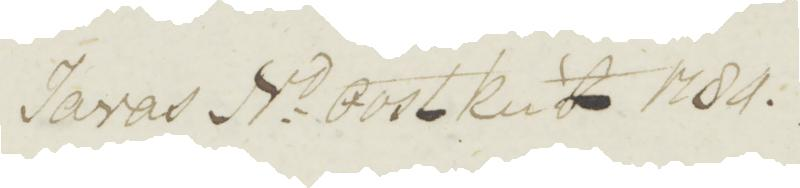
Iavas N:d oostkust 1784.
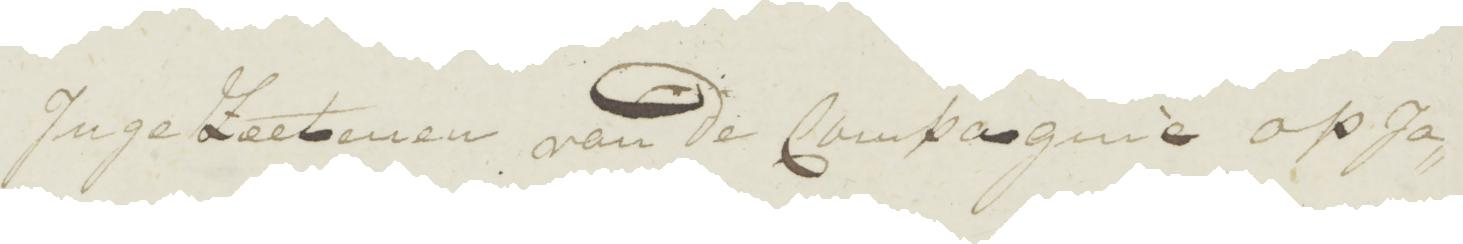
Jngezeetenen van de Compagnie op Ja„
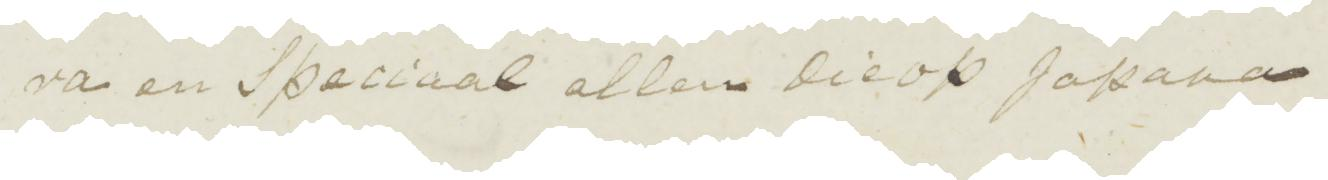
va en speciaal allen die op Japara
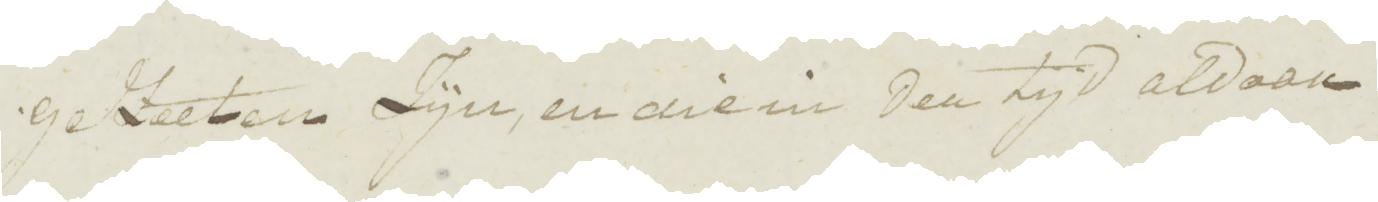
gezeeten zijn, en die in der tijd aldaar
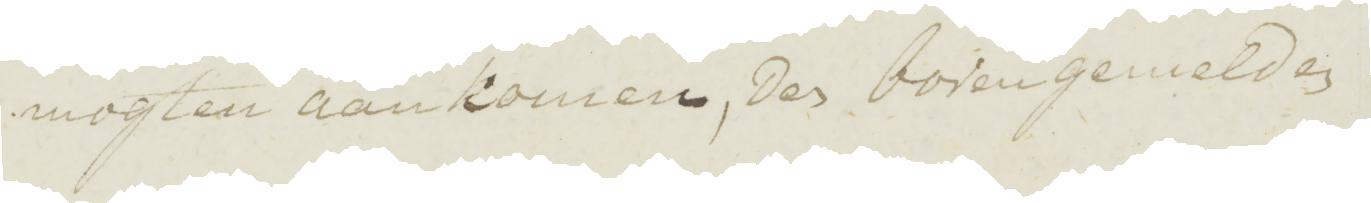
mogten aankomen, den bovengemelden
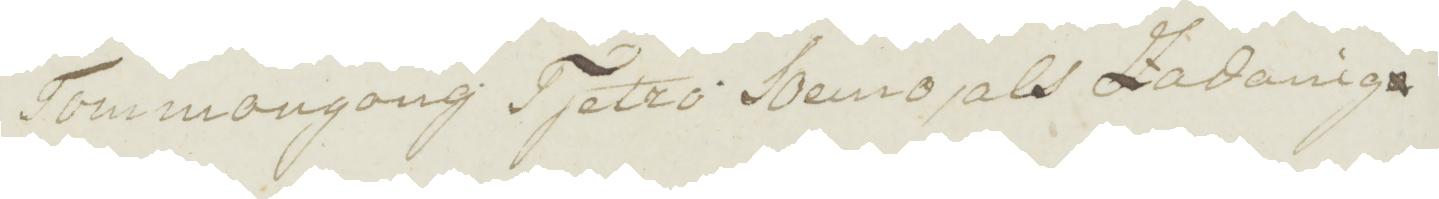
Tommongong Tjetro Soemo, als zodanige
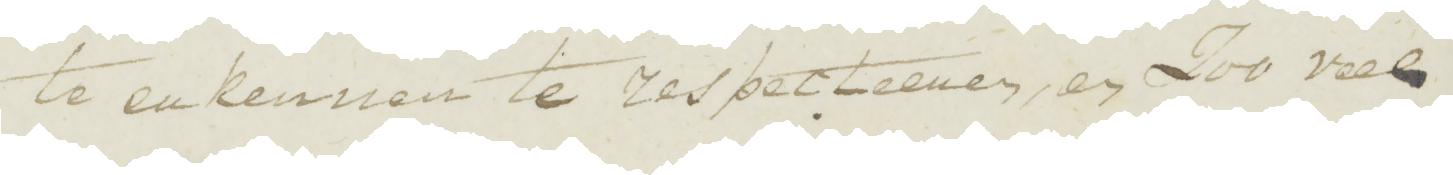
te erkennen te respecteeren, en zoo veel
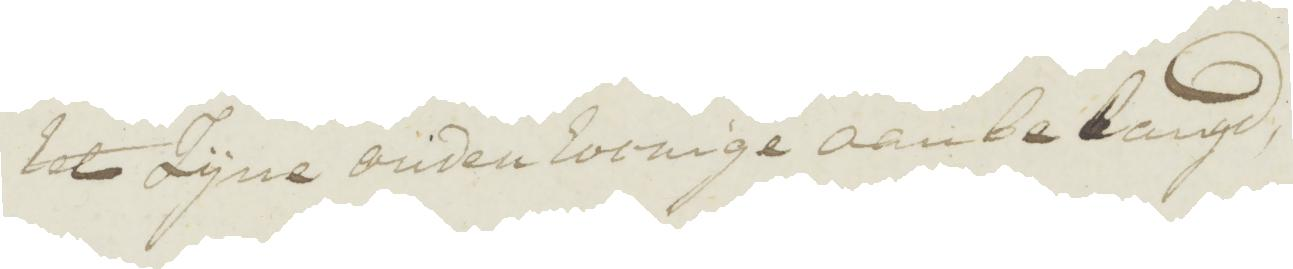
het Zijne onderhoorige aanbelangd,
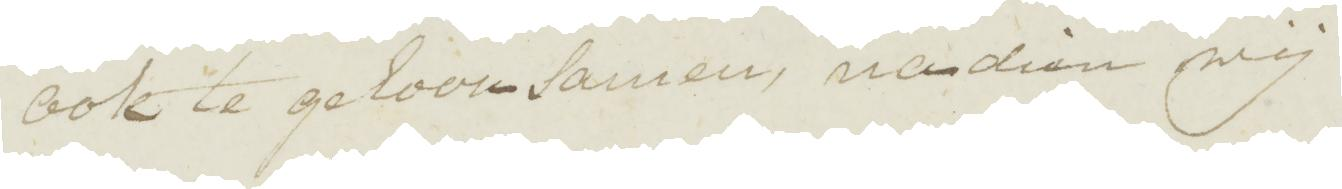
ook te gehoorsamen, nadien wij
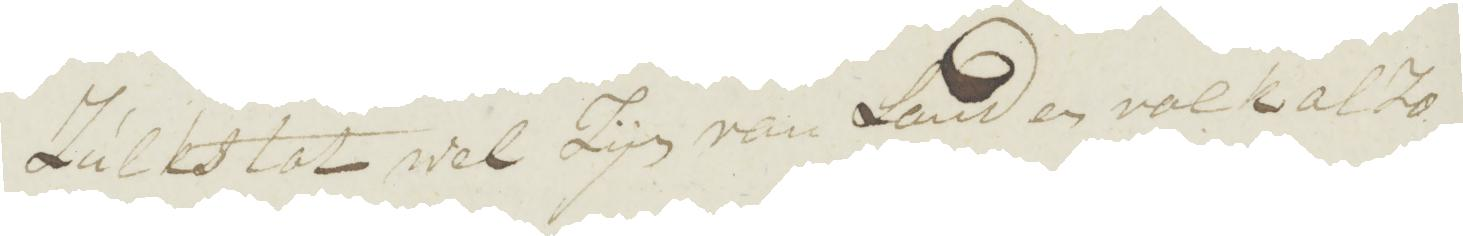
zulks tot wel zijn van land en volk alzo
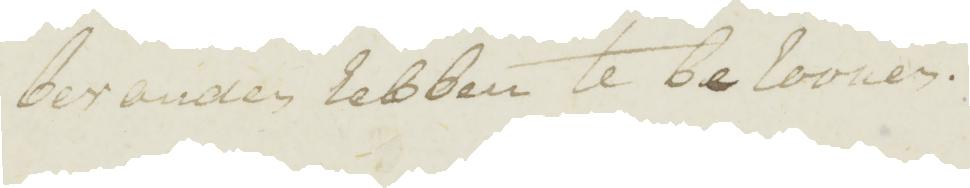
bevonden hebben te behooren.
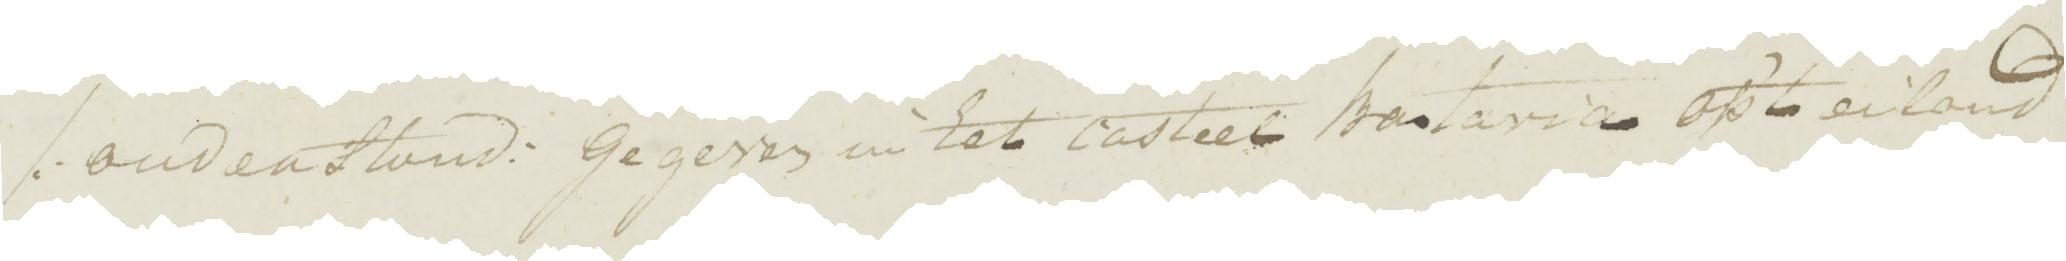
/,- onderstond: Gegeven in het casteel Batavia op 't eiland
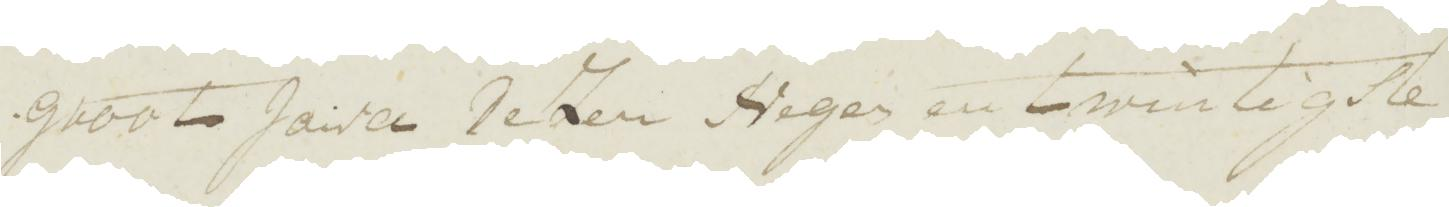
groot Java dezen Negen en twintigste
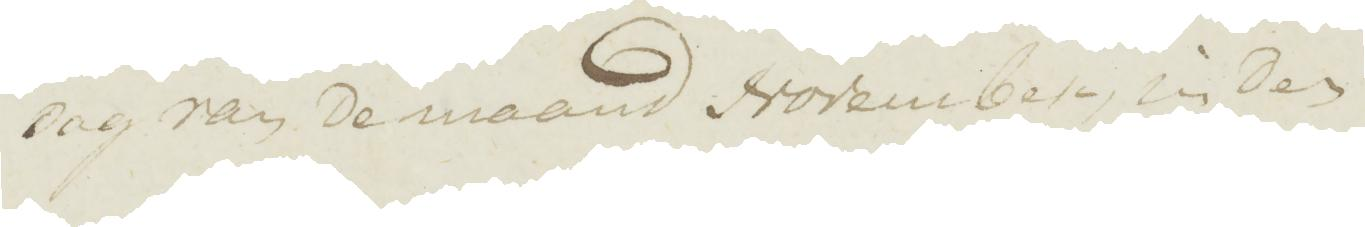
dag van de maand November, in den
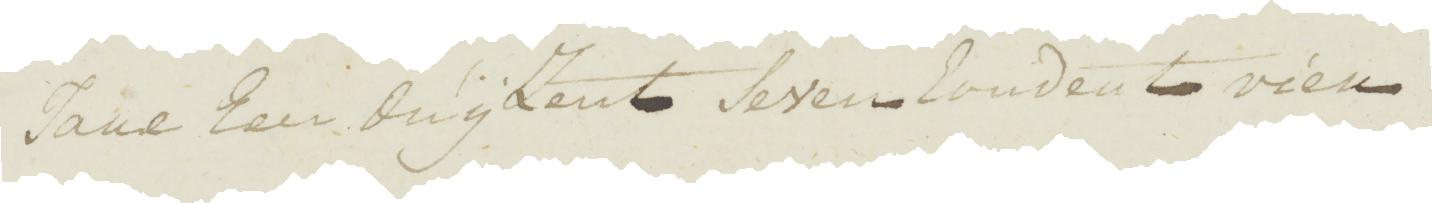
Iare Een duijzent seven hondert vier
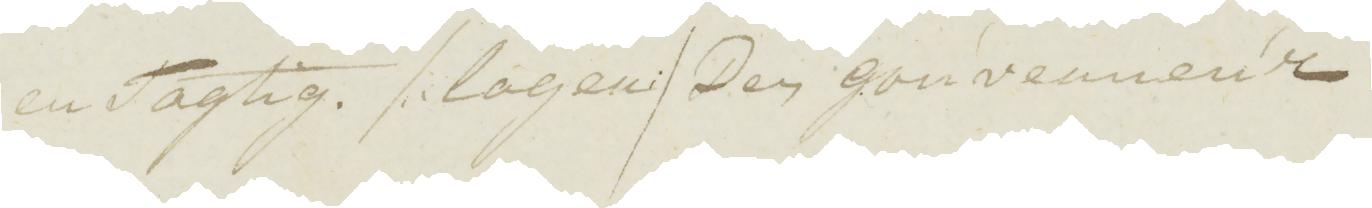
en Tagtig. /:lager:/ Den gouverneur
